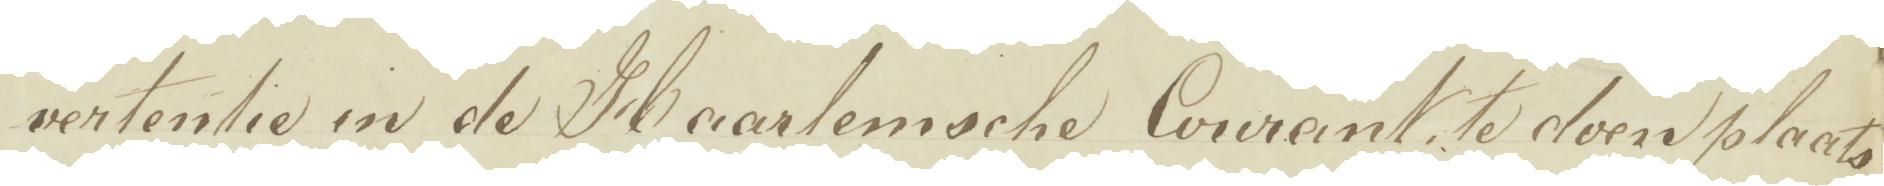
vertentie in de Haarlemsche Courant, te doen plaats
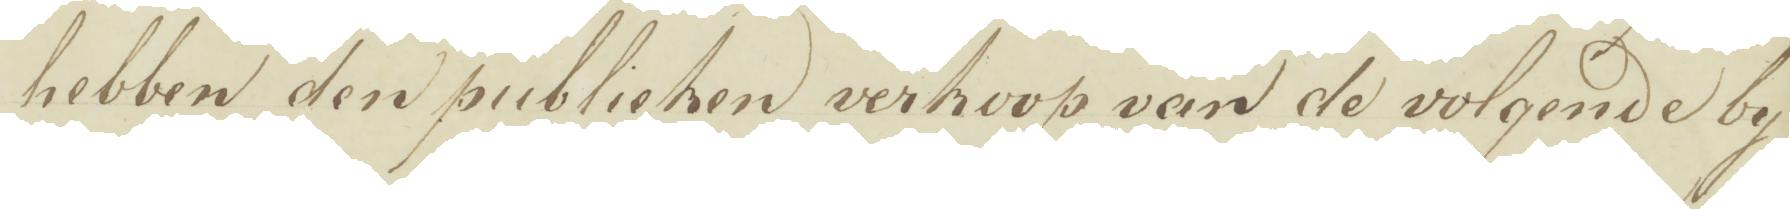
hebben den publieken verkoop van de volgende by
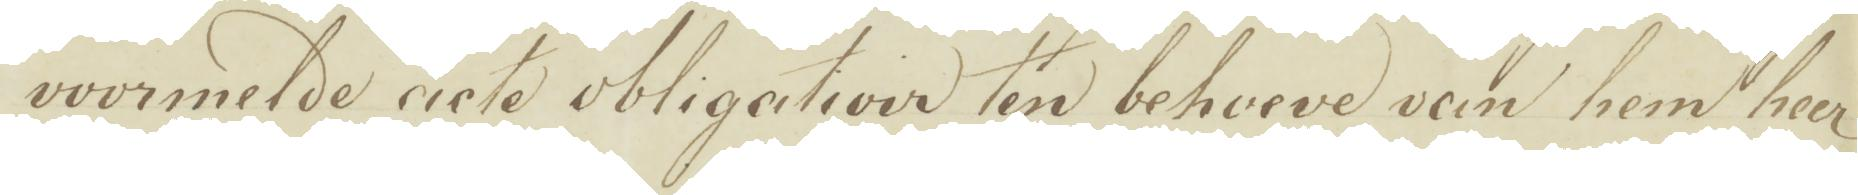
voormelde acte obligatioir ten behoeve van hem heer
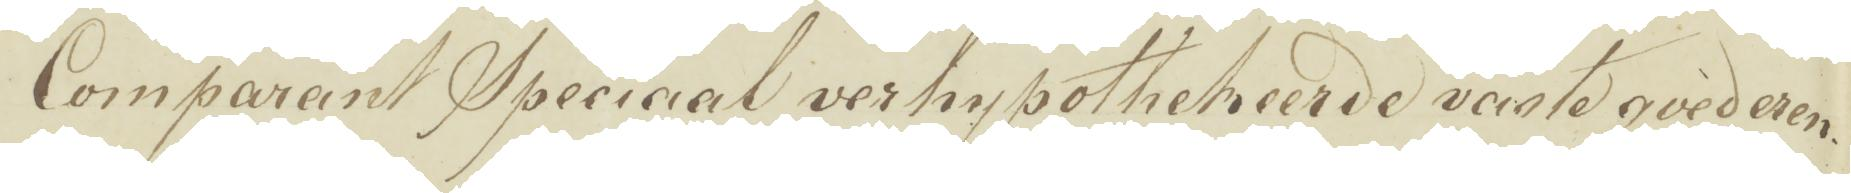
Comparant Speciaal verhypothekeerde vaste goederen,
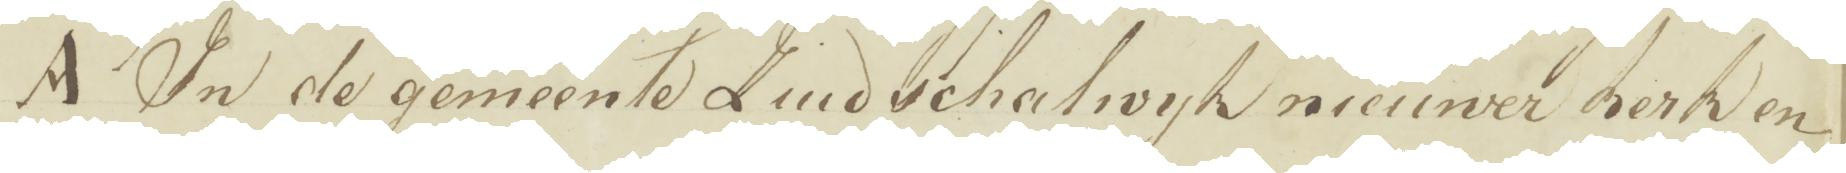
A In de gemeente Zuid schalwyk nieuwer kerk en
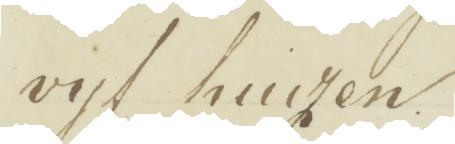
vijf huizen.
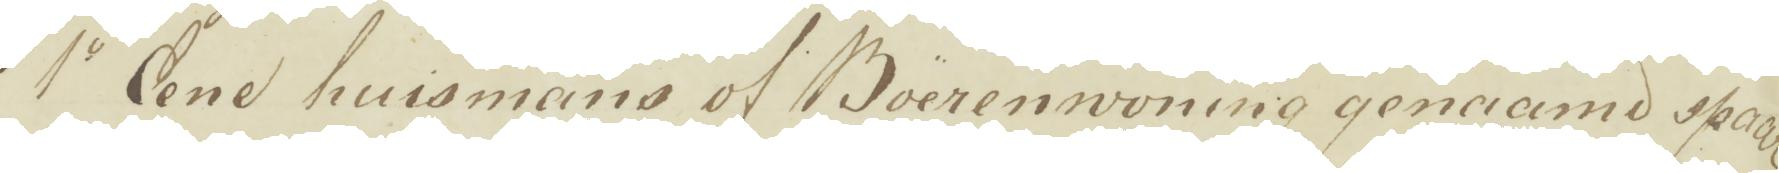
1.o Eene huismans of Boerenwoning genaamd spaar
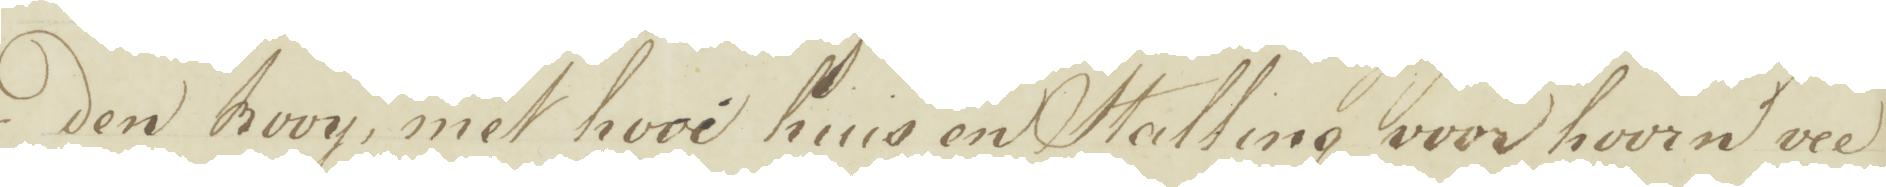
-den kooy, met hooi huis en Stalling voor hoorn vee
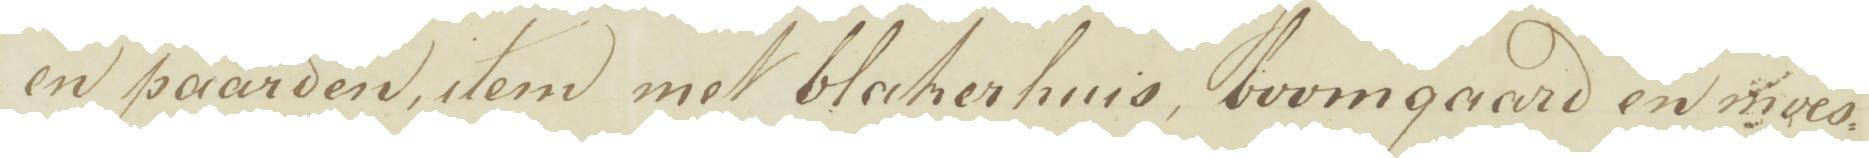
en paarden, item met blakerhuis, boomgaard en moes„
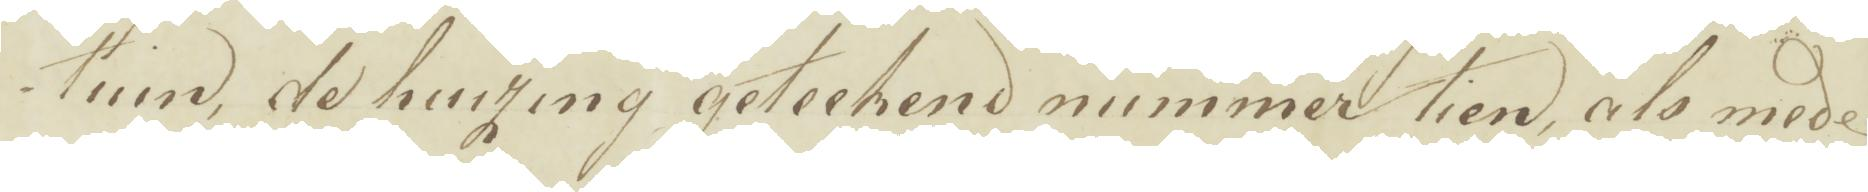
„tuin, de huizing geteekend nummer tien, als mede
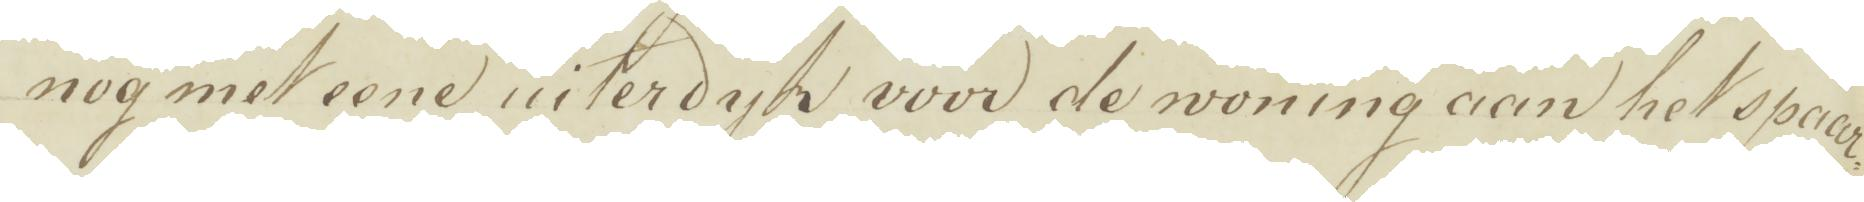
nog met eene uiterdyk voor de woning aan het spaar„
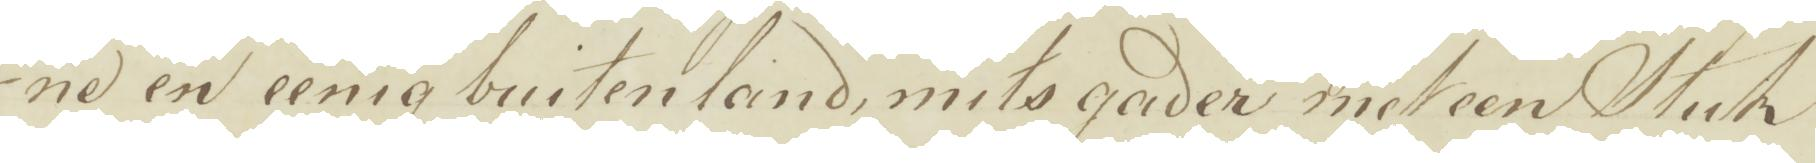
„ne en eenig buitenland, mits gader met een Stuk
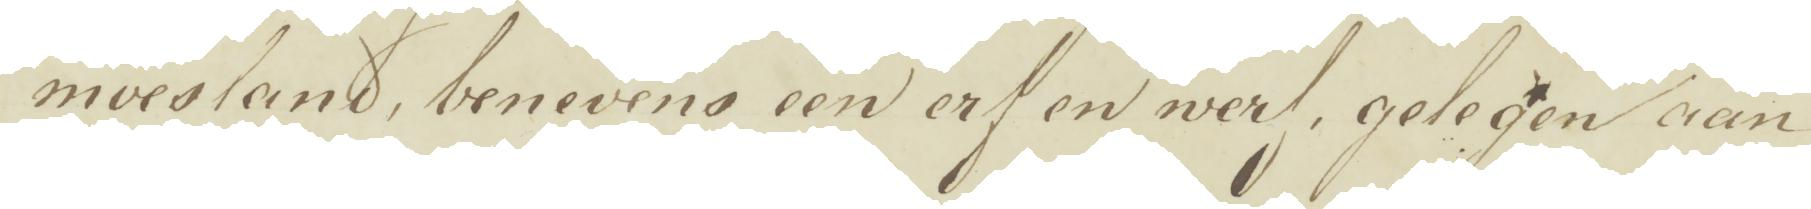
moesland, benevens een erf en werf, gelegen aan
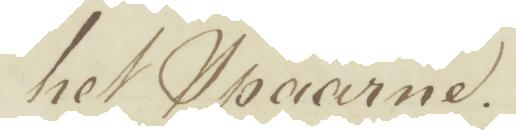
het Spaarne.
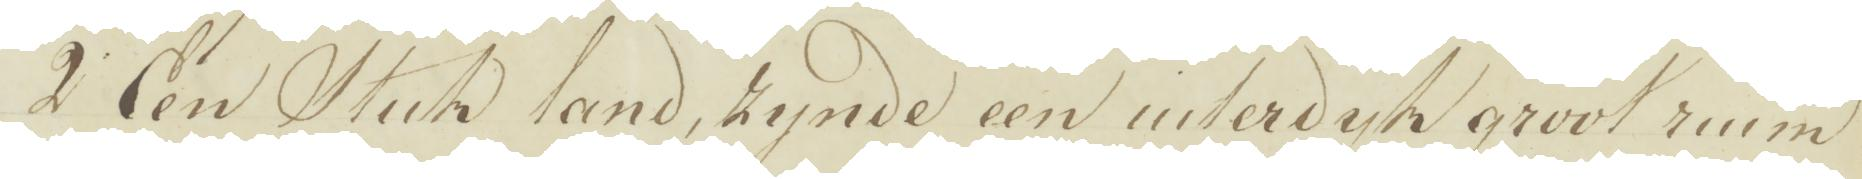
2' Een Stuk land, zynde een uiterdyk groot ruim
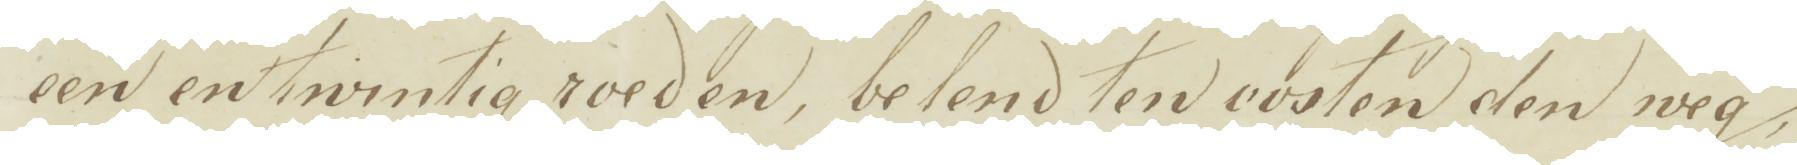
een en twintig roeden, belend ten oosten den weg,
